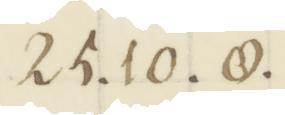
25.10. 8.
